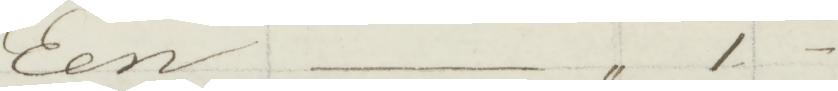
Een — „ 1 —
